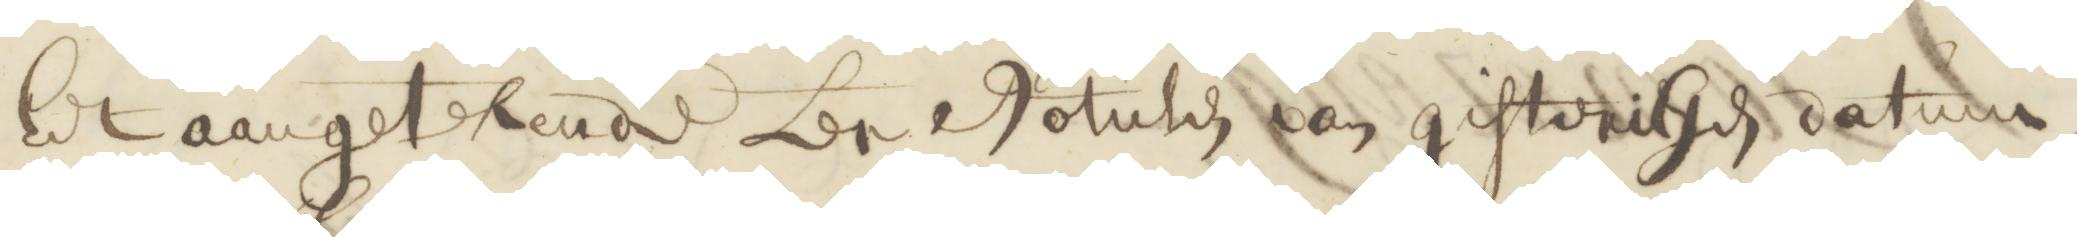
het aangetekende ter Notulen van gisteriGen datum
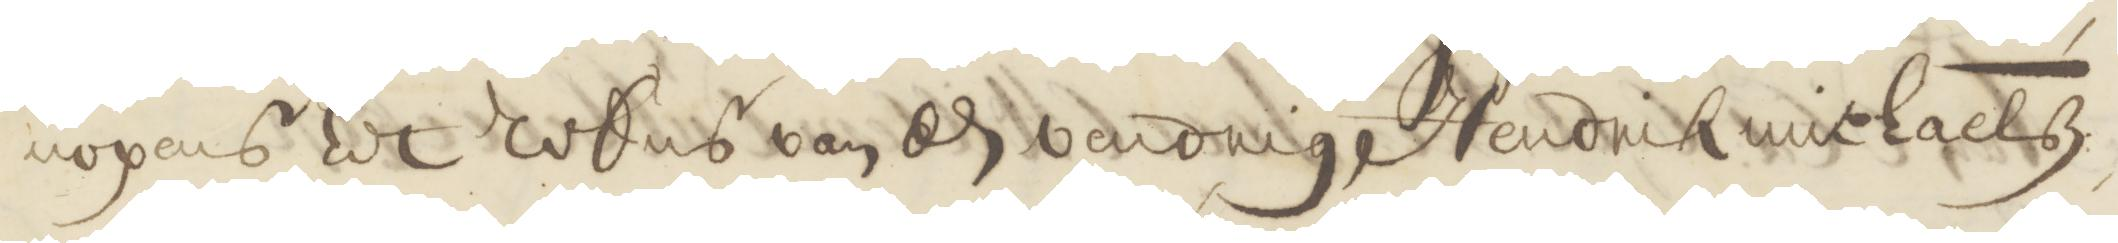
nopens het Refus van den vendrig Hendrik michaelsz:
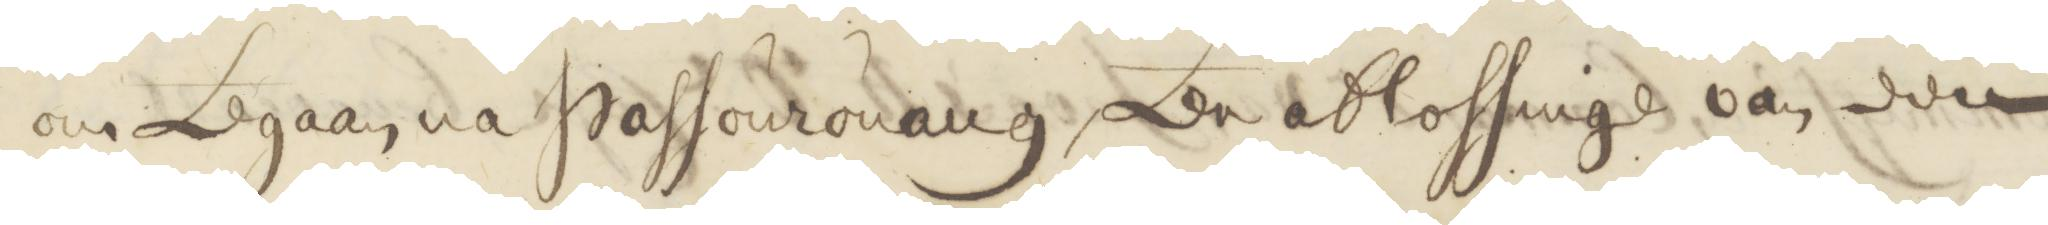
om te gaan na Passourouang, ter aflossinge van een
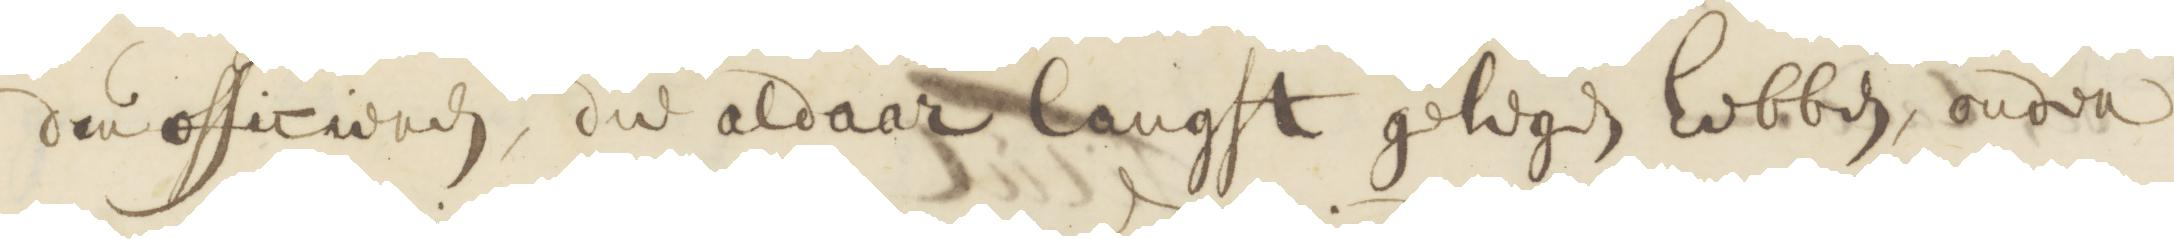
der officieren, die aldaar langst gelegen hebben, onder
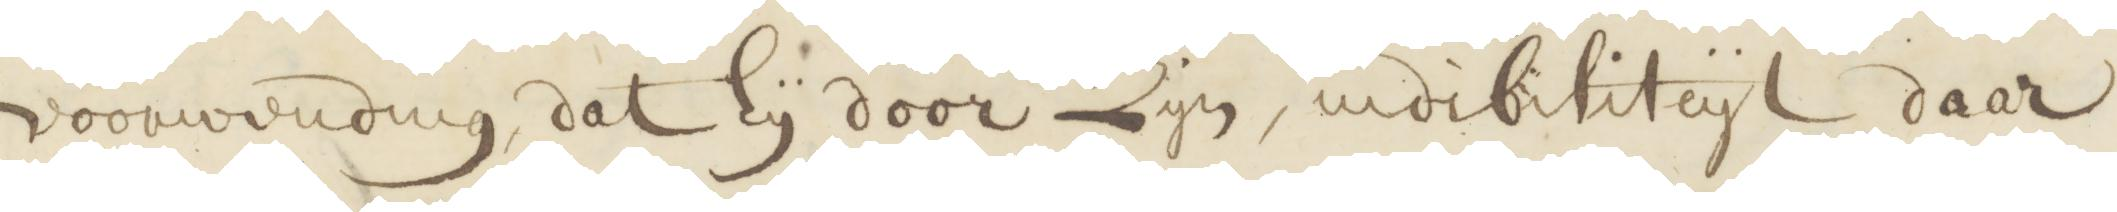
voorwending, dat hij door zijn, indibiliteijt daar
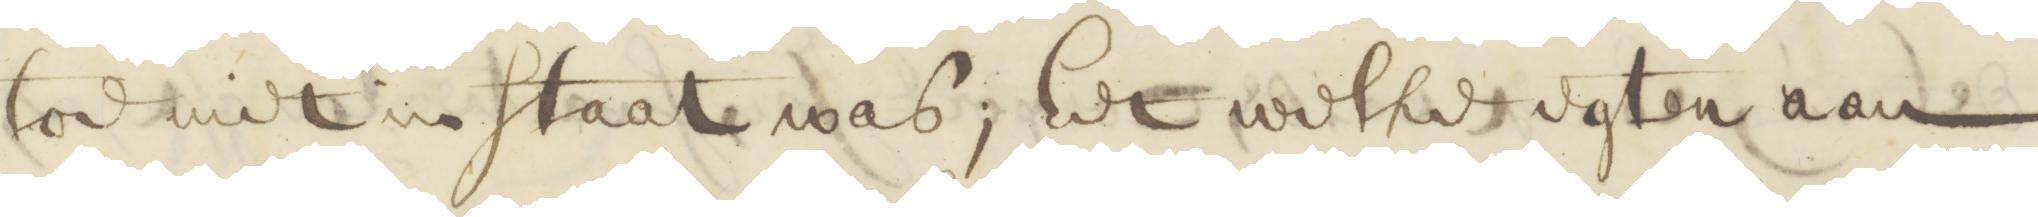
toe niet in staat was; het welke egter aan
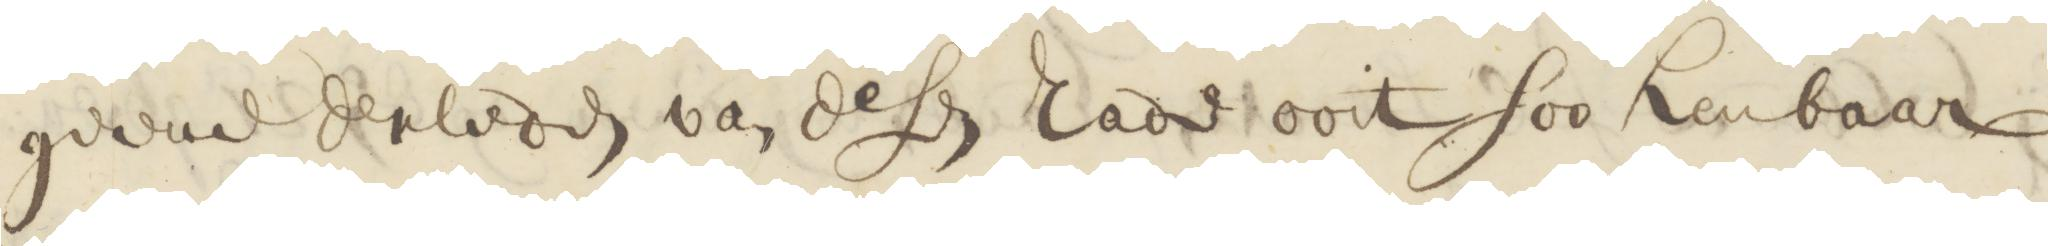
geene der leden van desen Rade ooit soo kenbaar
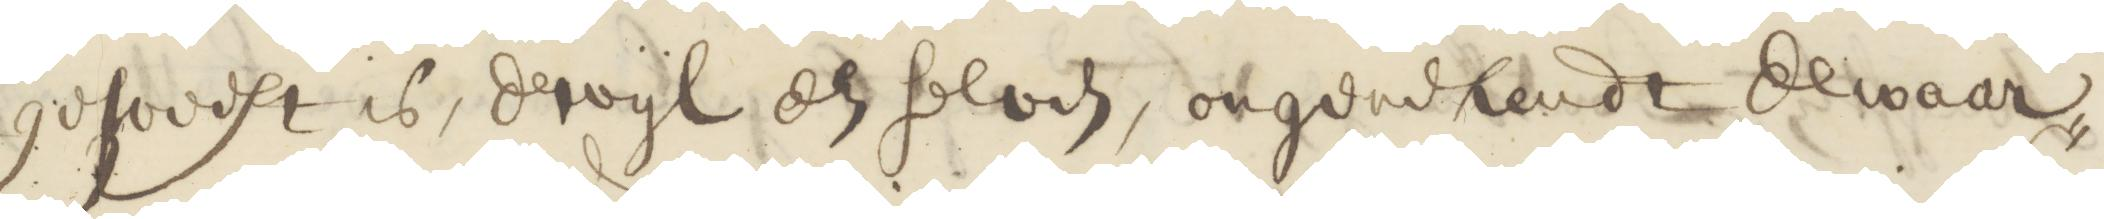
geweest is, dewijl den selven, ongerekendt de waar„
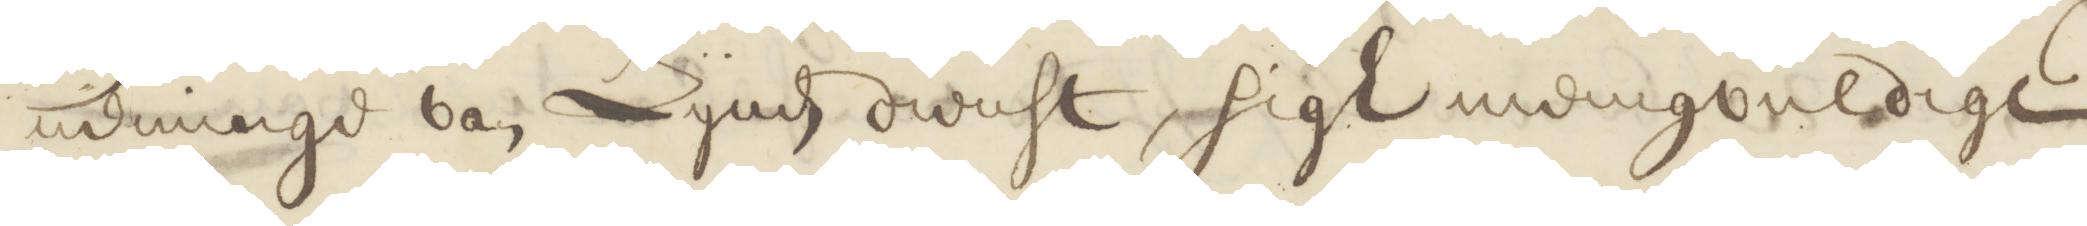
neminge van zijnen dienst, sigh menigvuldige
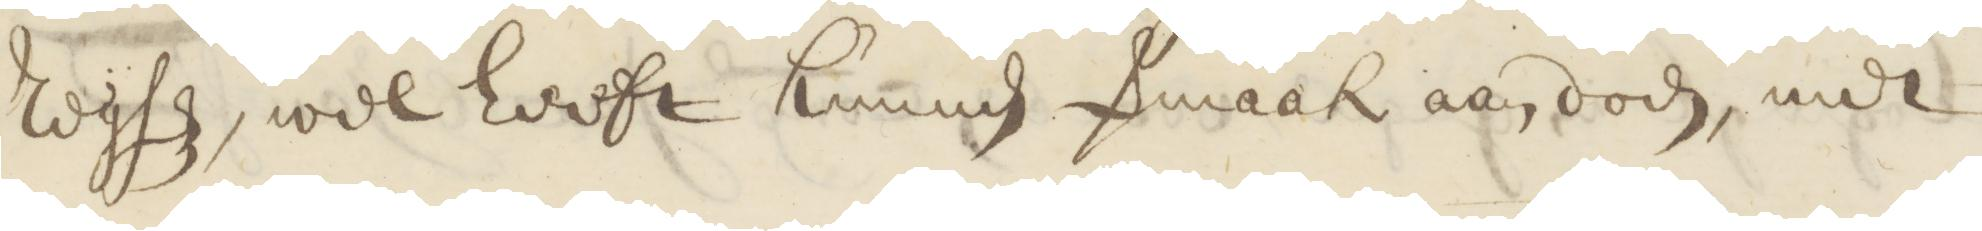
Reijsen, wel heeft kunnen vermaak aan doen, niet
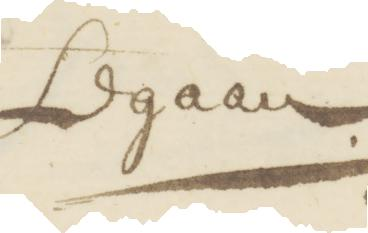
te gaan
